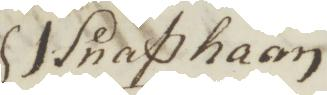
1 Snaphaan
